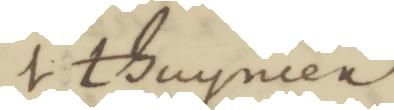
1 thuynier
